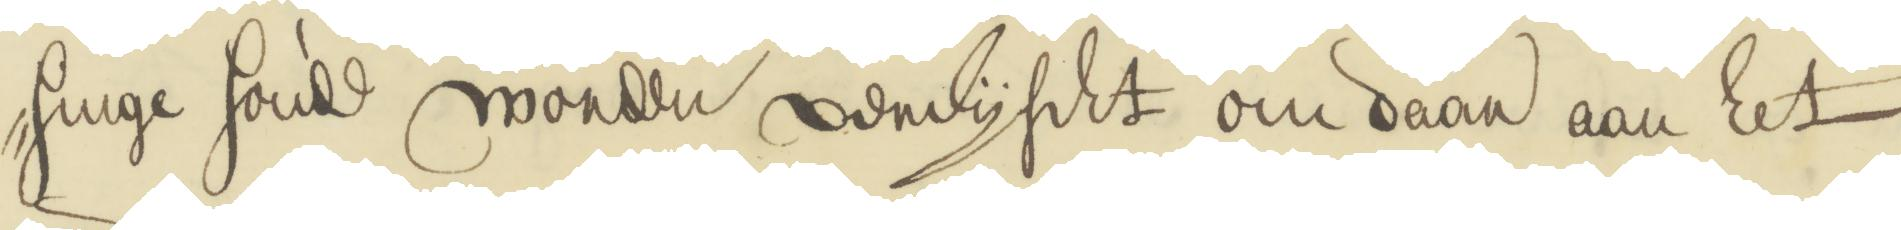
singe soude worden vereijscht om daar aan het
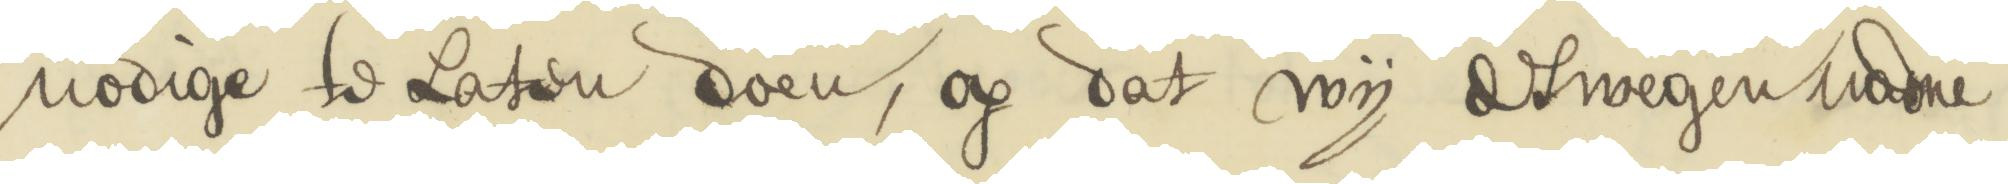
nodige te laten doen, op dat wij deswegen nadre
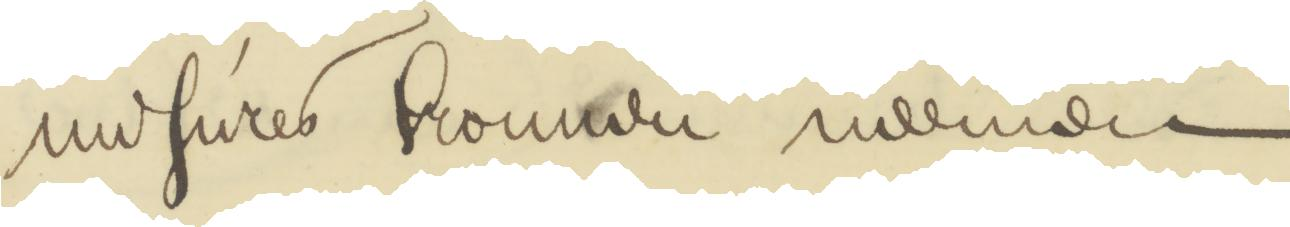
mesures konnen neemen
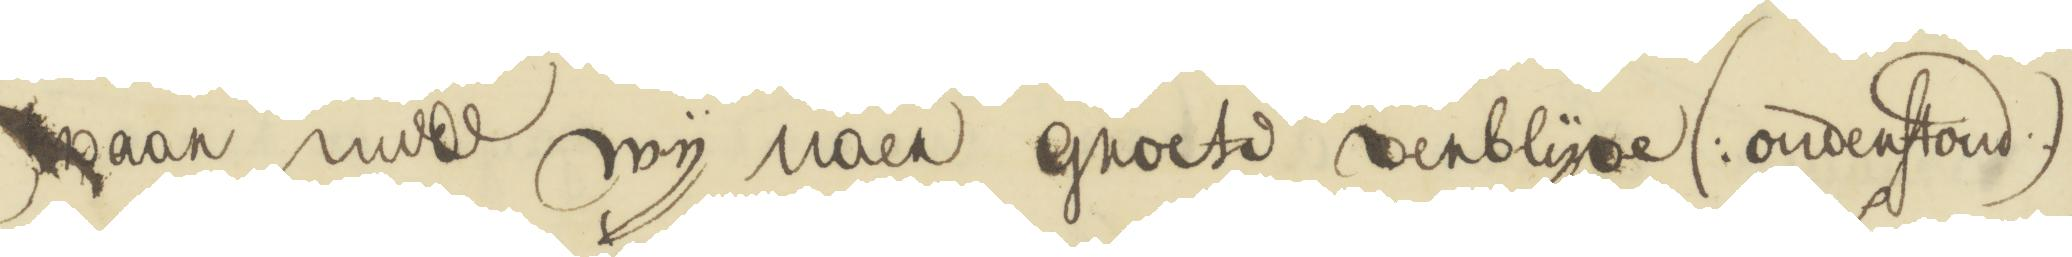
waar mede wij naer groete verblijve (:onderstond:)
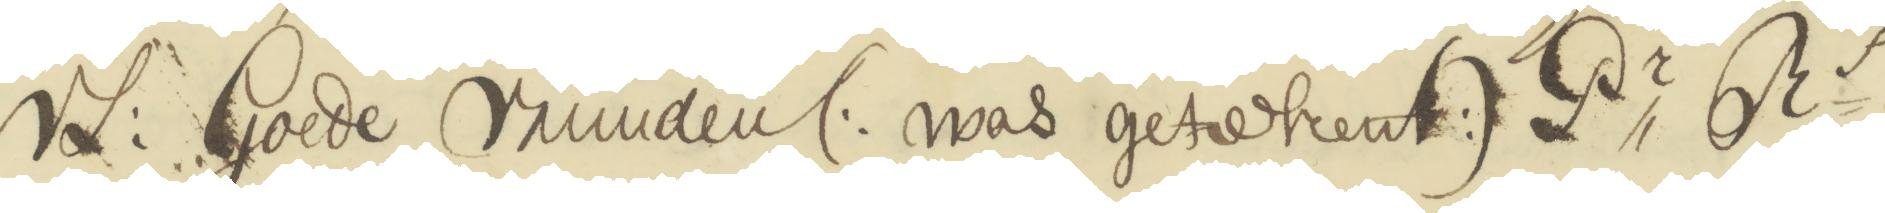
VL: Goede vrunden (:was geteekent:) P„r R=s
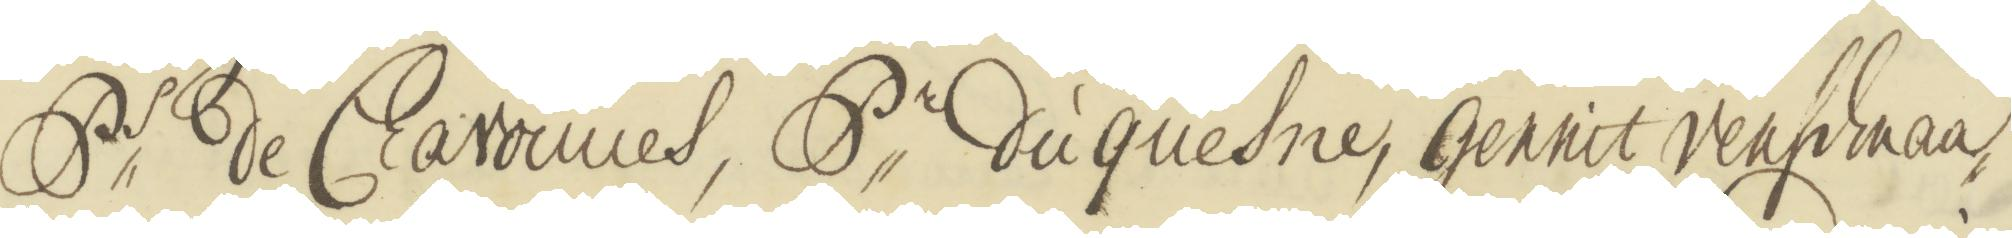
P„s de Chavonnes, P„r du quesne, gerrit verschraa„
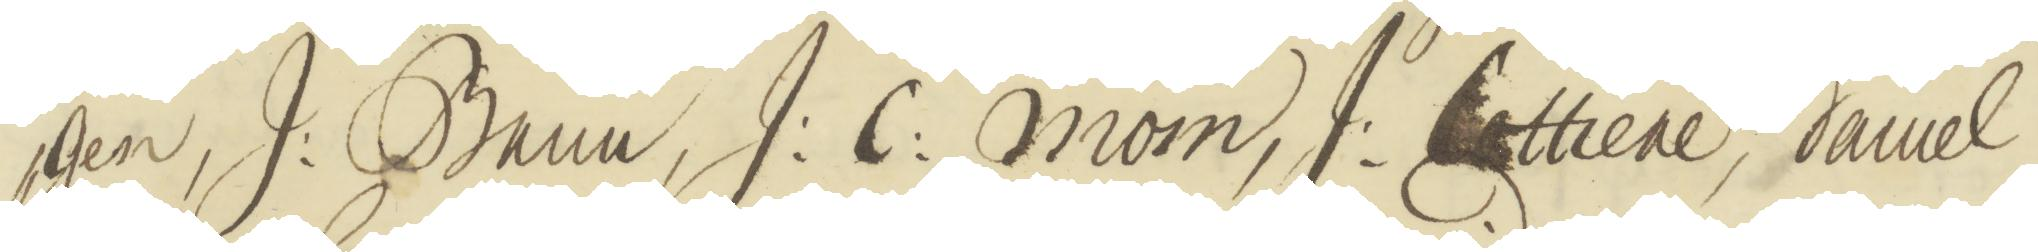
gen, J: Brun, J: C: mom, J: Cottiere, daniel
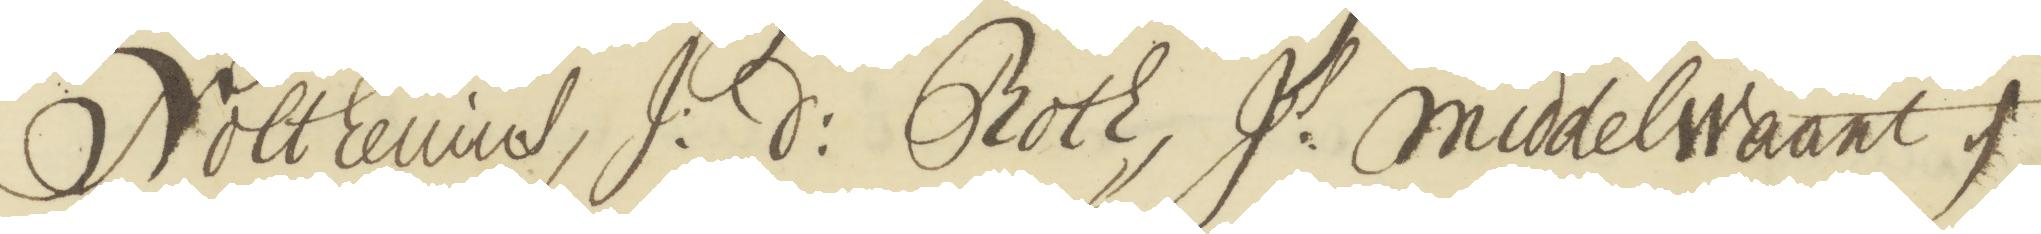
Nolthenius, J: d: Roth, J:s middelwaarts
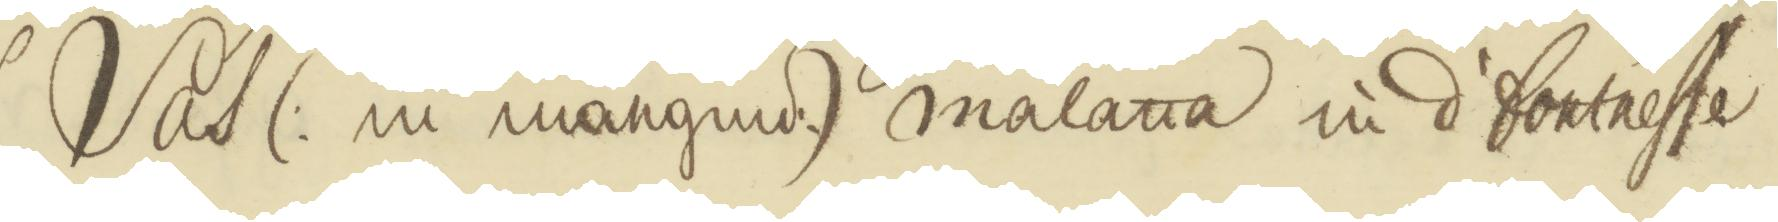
J:s J:s Sas (:in margine:) malacca in d’ fortresse
